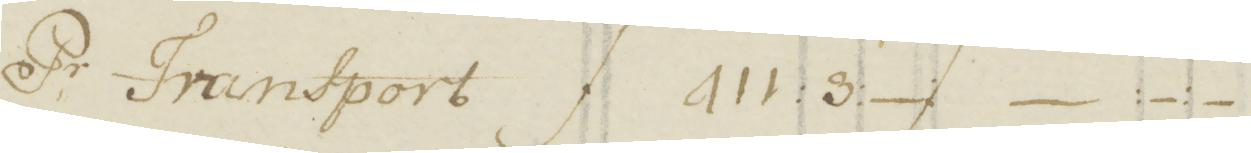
P„r Transport ƒ 411: 3: — ƒ — : — : —
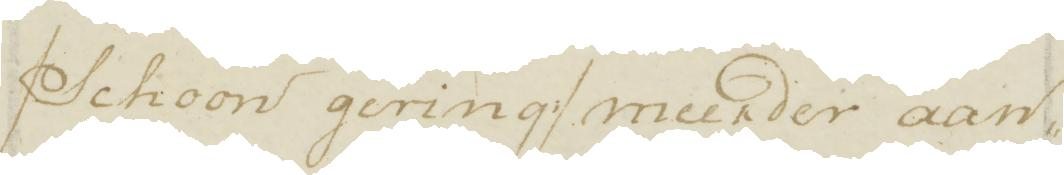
/schoon gering/ meerder aan„
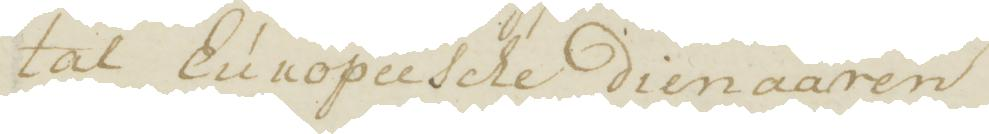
tal Europeesche dienaaren
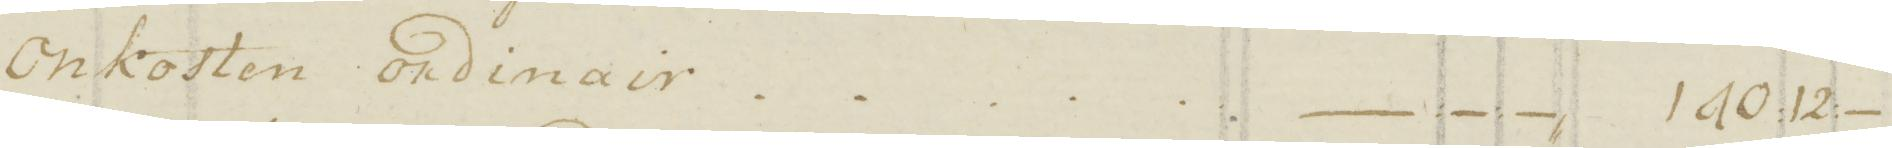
Onkosten ordinair . . . . . . — — — „ 140: 12: —
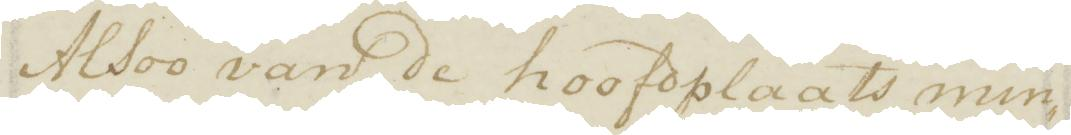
Alsoo van de hoofdplaats min„
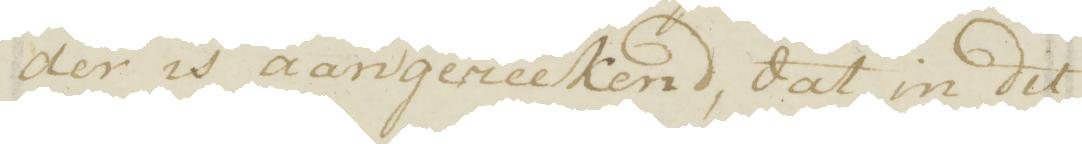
der is aangereekend, dat in dit
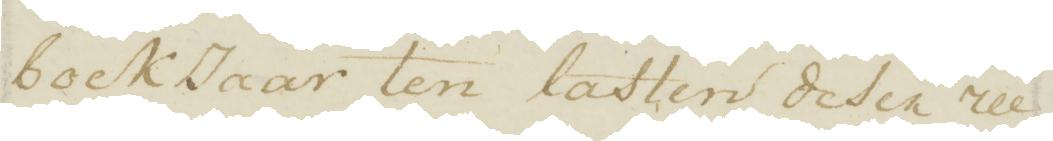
boekIaar ten lasten deser ree
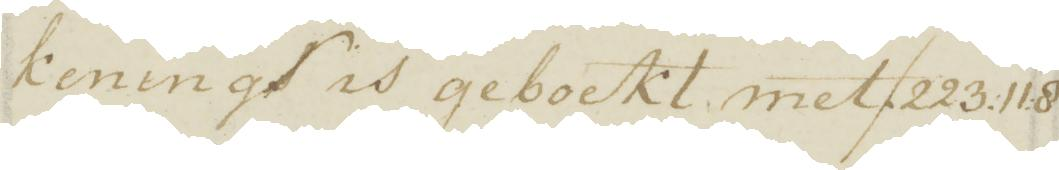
kenings is geboekt met ƒ223:11:8
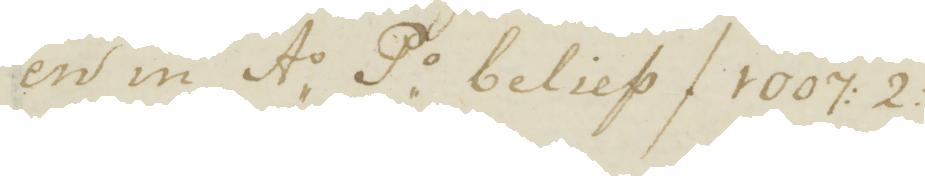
en in A„o P„o beliep ƒ1007:2:
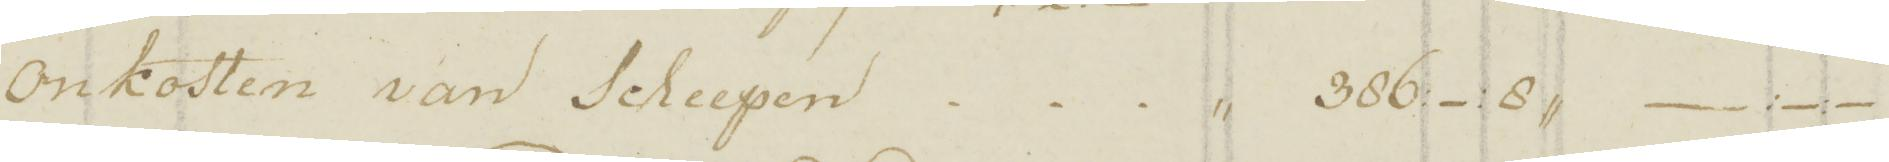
Onkosten van scheepen - - - „ 386: —: 8 „ —: —: —
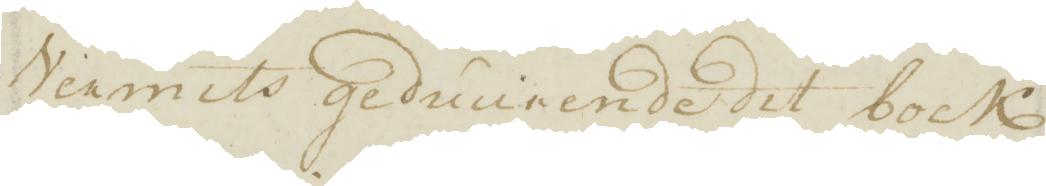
vermits geduurende dit boek
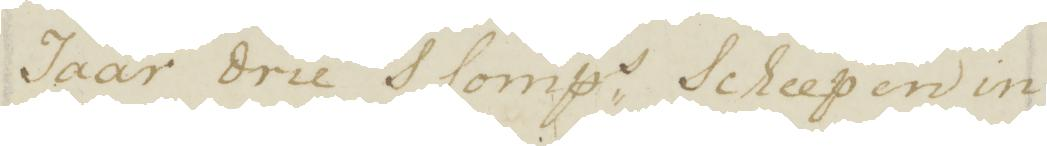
Iaar drie ’s Comp„s scheepen in
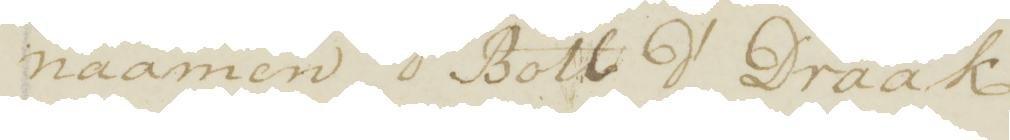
naamen d' Bott d’ Draak
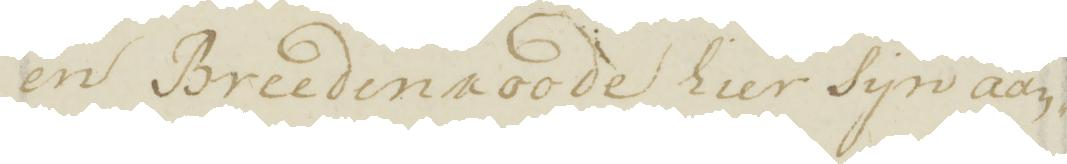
en Breedenroode hier sijn aan„
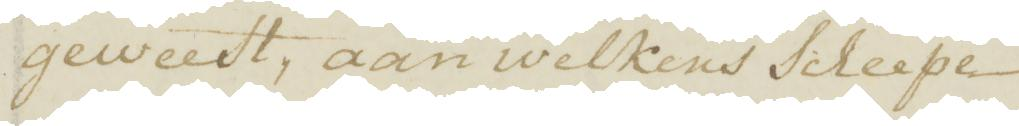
geweest, aan welkens scheepe
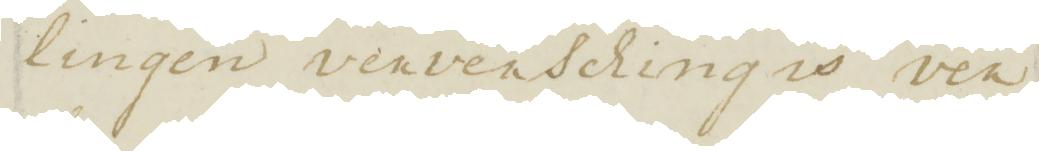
lingen verversching is ver
